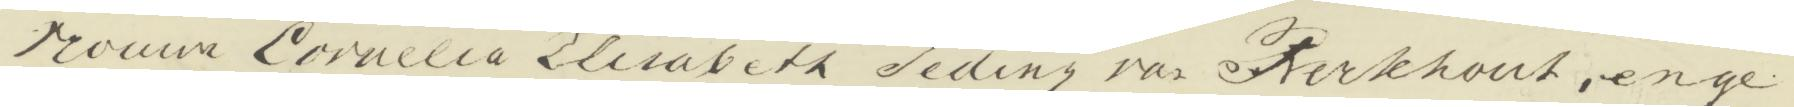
Vrouwe Cornelia Elisabeth Teding van Berkhout, en ge.
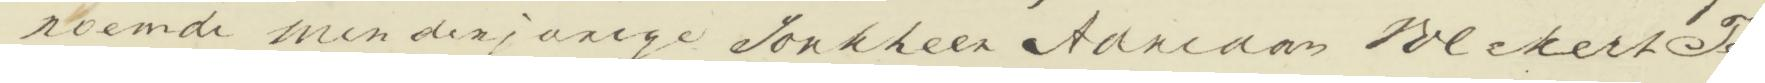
noemde minderjarige Ionkheer Adriaan Volckert Te
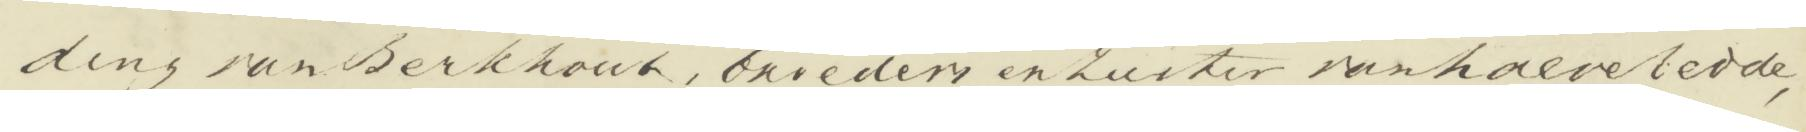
ding van Berkhout, broeder en zuster van halve bedde,
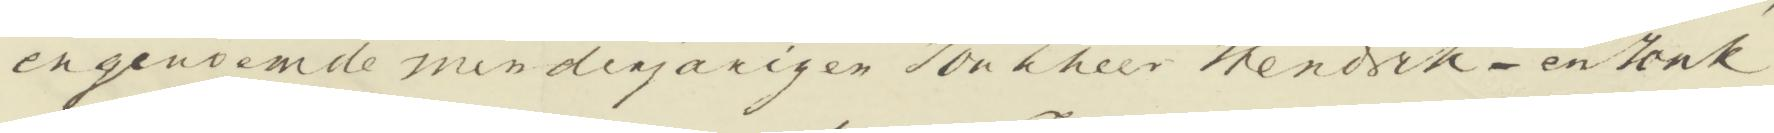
en genoemde minderjarigen Ionkheer Hendrik - en Ionk
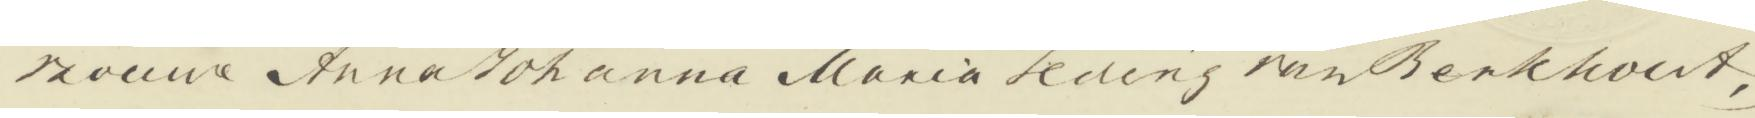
vrouwe Anna Johanna Maria Teding van Berkhout,
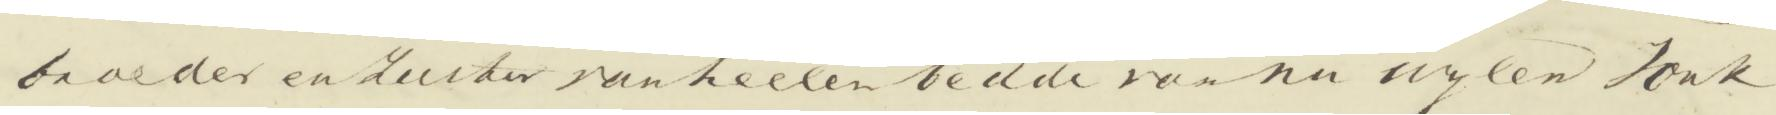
broeder en zuster van heelen bedde van nu wylen Ionk
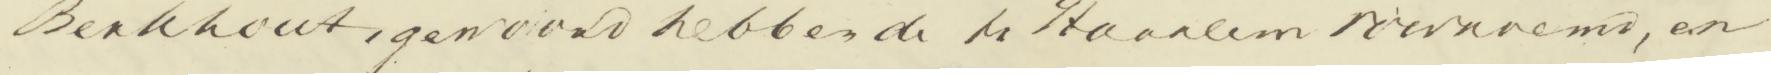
Berkhout, gewoond hebbende te Haarlem voornoemd, en
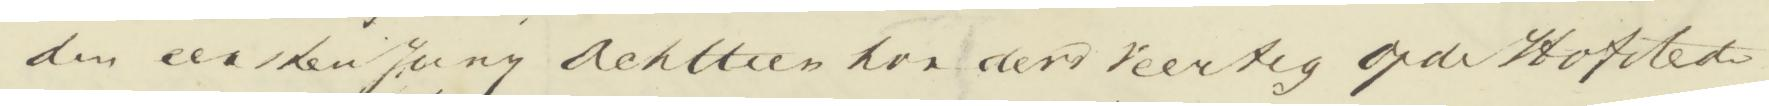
den eersten Juny achttien honderd veertig op de Hofstede
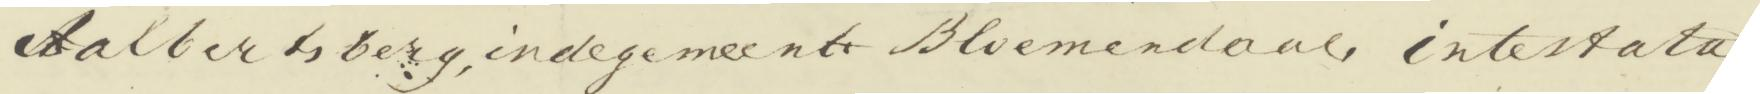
Aalbertsberg, in de gemeente Bloemendaal, intestata
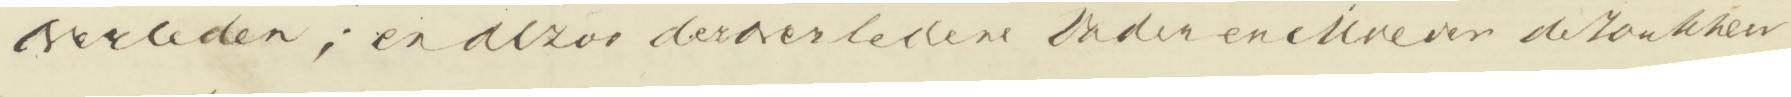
overleden; en alzoo der overledene vader en moeder de Ionkheer
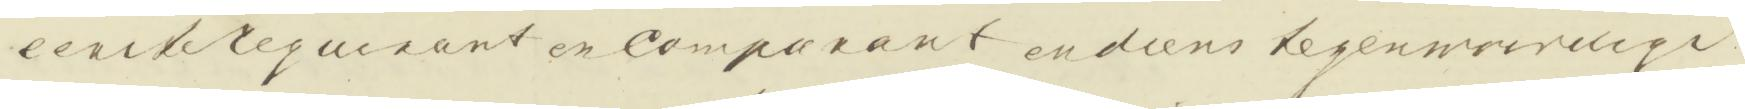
eerste requirant en comparant en diens tegenwoordige
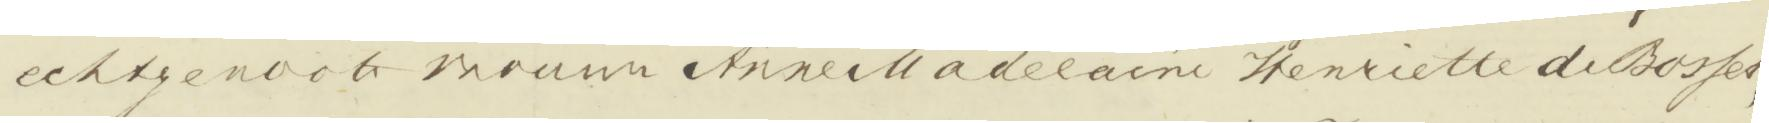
echtgenoot vrouwe Anne Madelaine Henriette de Bosset,
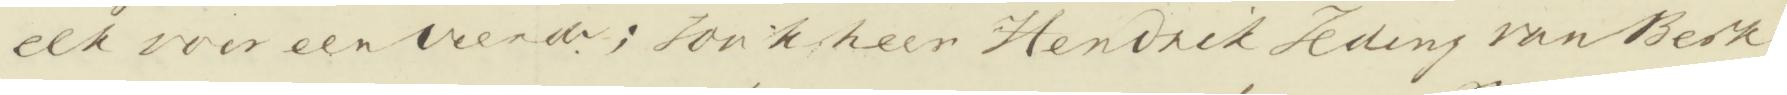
elk voor een vierde; Ionkheer Hendrik Teding van Berk
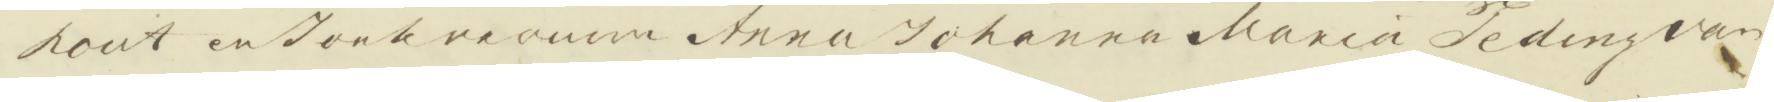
hout en Ionkvrouwe Anna Iohanna Maria Teding van
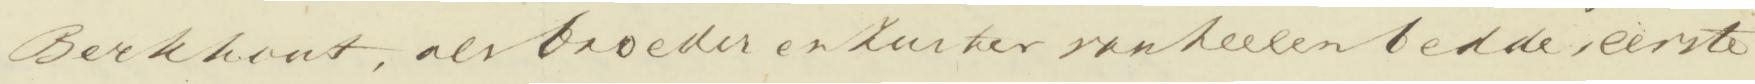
Berkhout, als broeder en zuster van heelen bedde, eerste
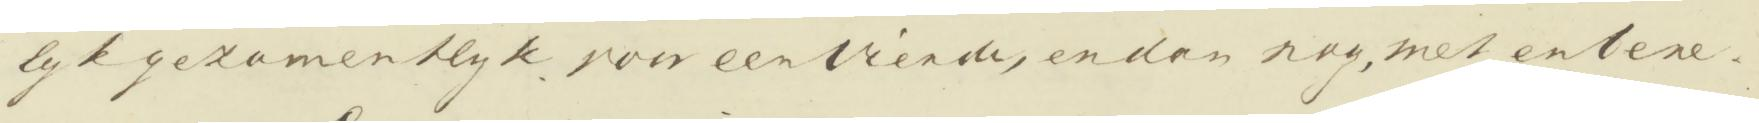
lyk gezamentlyk voor een vierde, en dan nog, met en bene„
